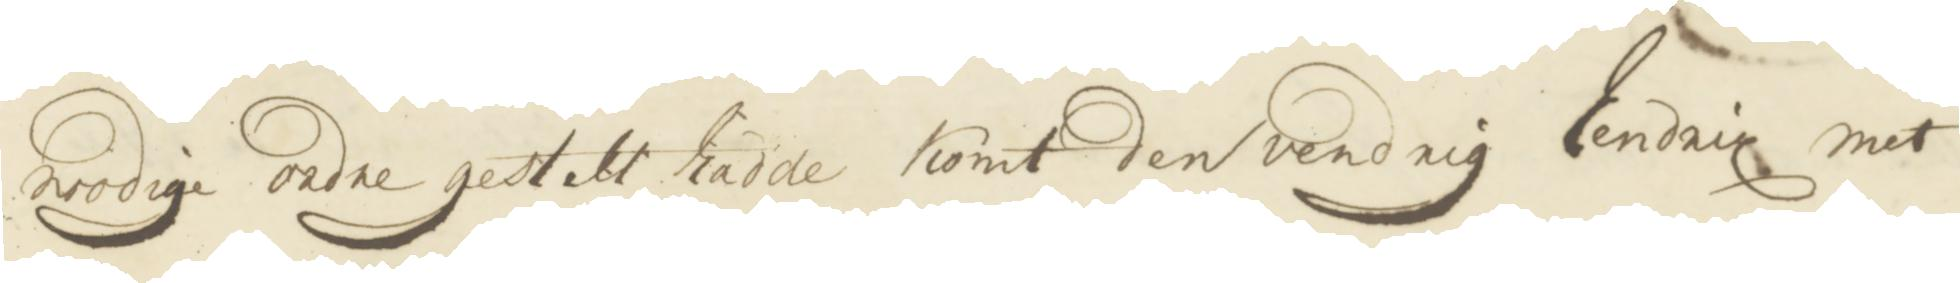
noodige ordre gestelt hadde komt den vendrig hendrix met
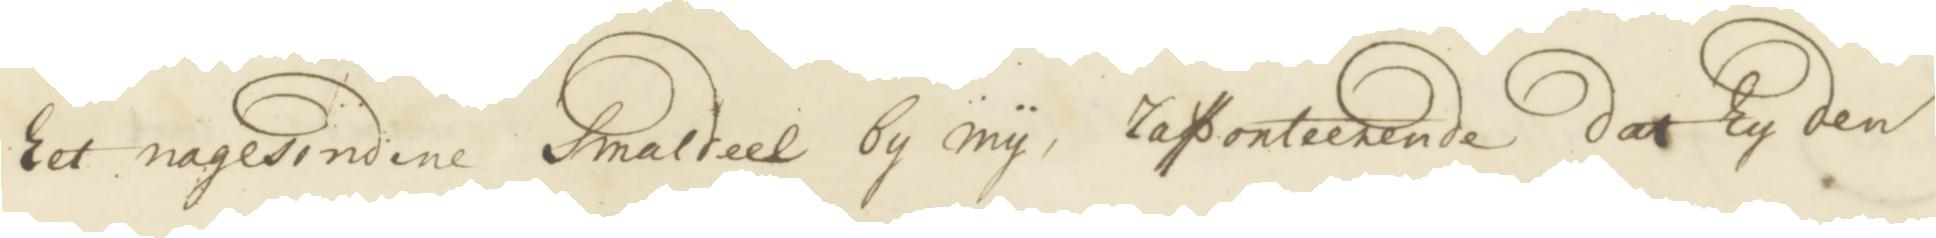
het nagesondene smaldeel bij mij, rapporteerende dat hy den
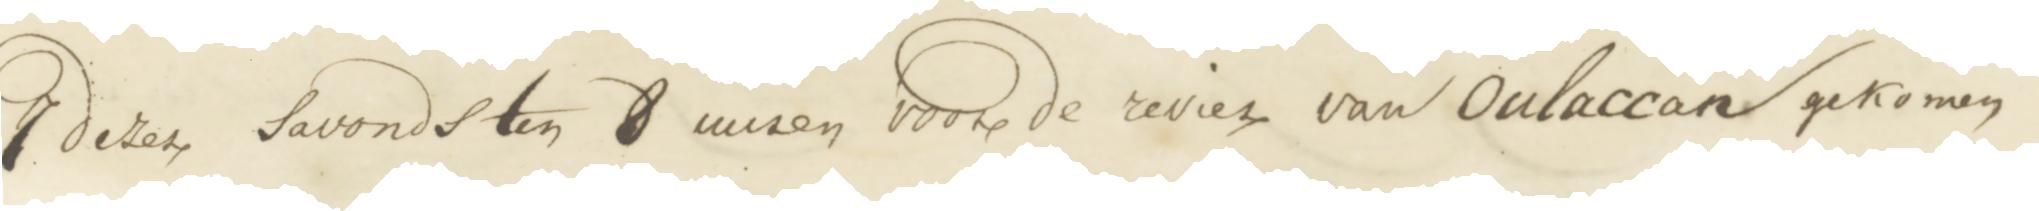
7 dezer savonds ten 8 uuren voor de revier van Oulaccan gekomen
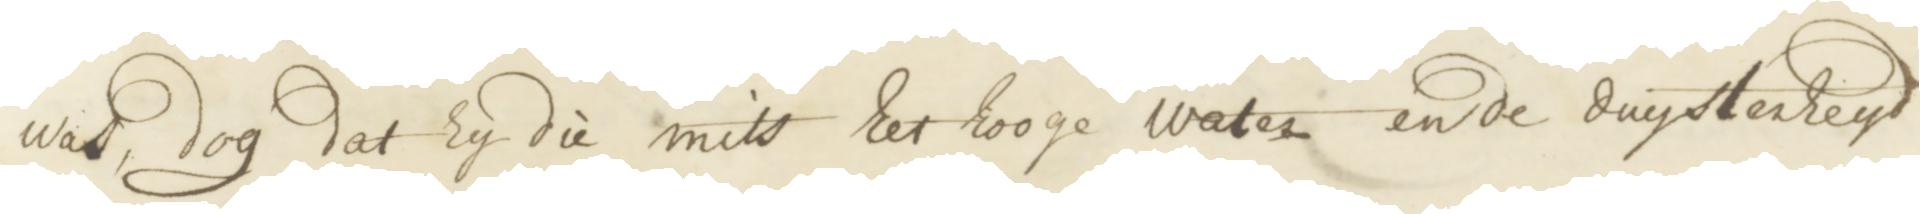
was, dog dat hy die mits het hooge water en de duysterheyd
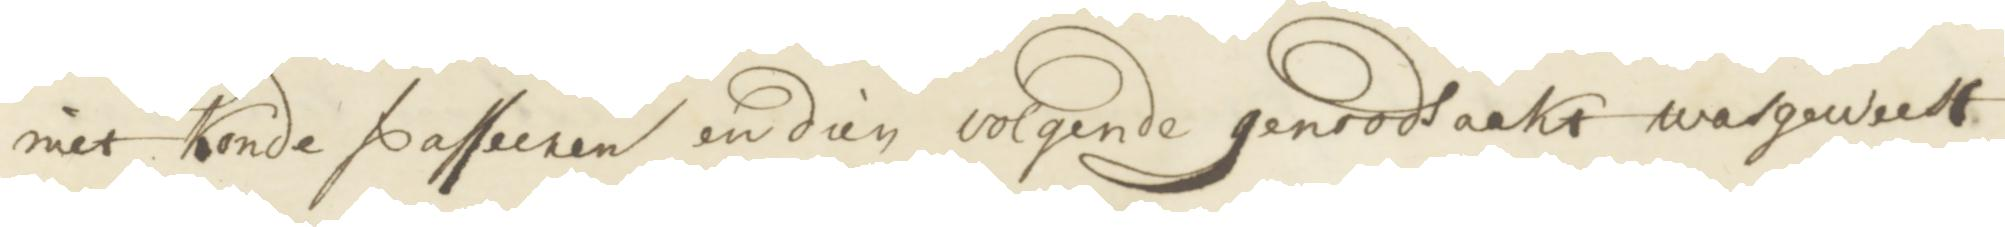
niet konde passeeren en dien volgende genoodsaakt was geweest
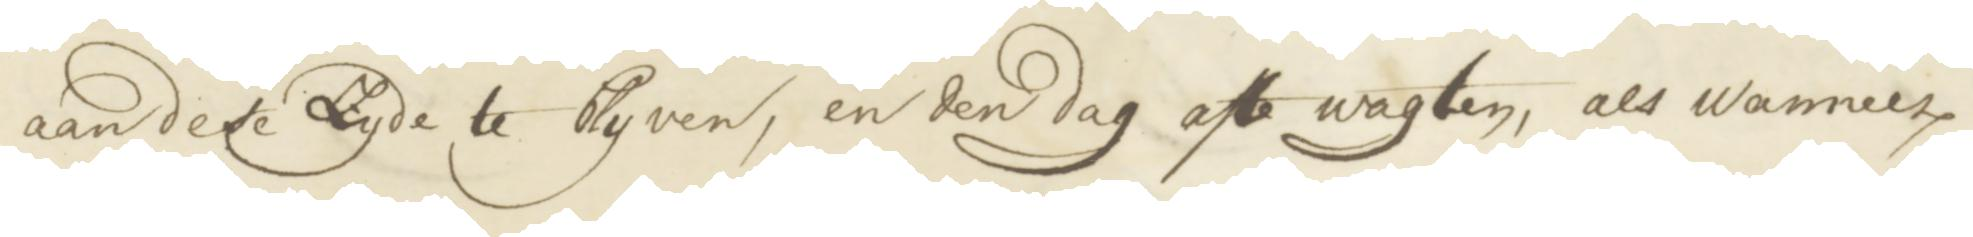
aan dese zyde te blyven, en den dag afte wagten, als wanneer
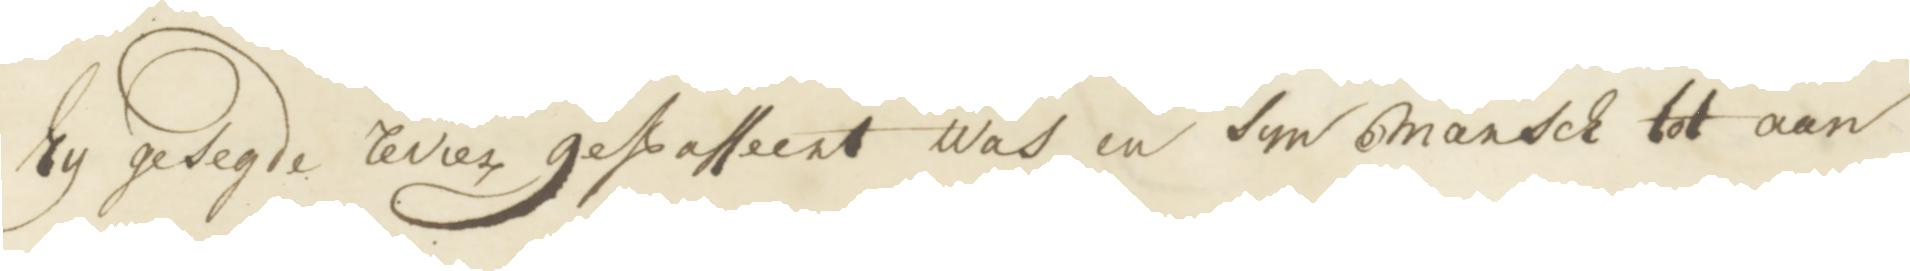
hy gesegde revier gepasseert was, en syn marsch tot aan
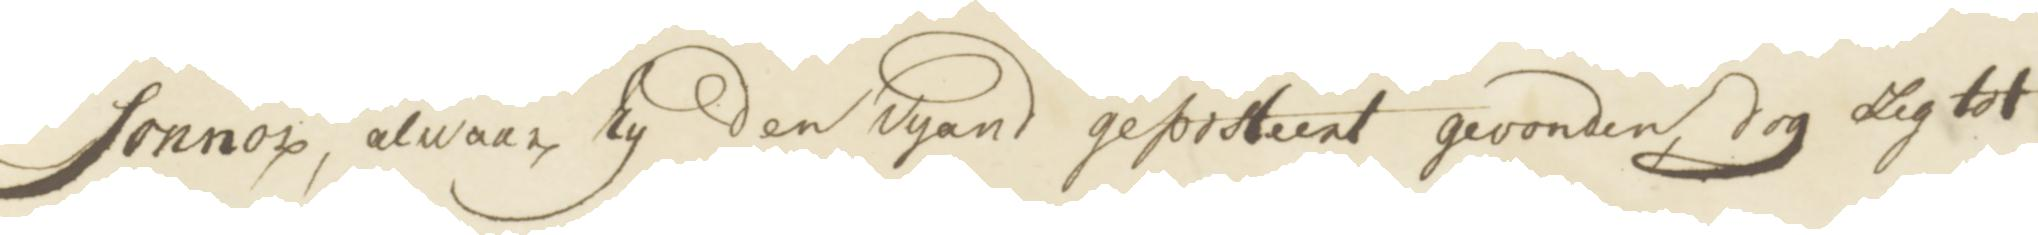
Jonnor, alwaar hy den vyand geposteert gevonden, dog zig tot
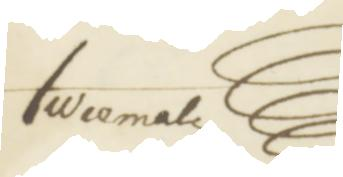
tweemalen
